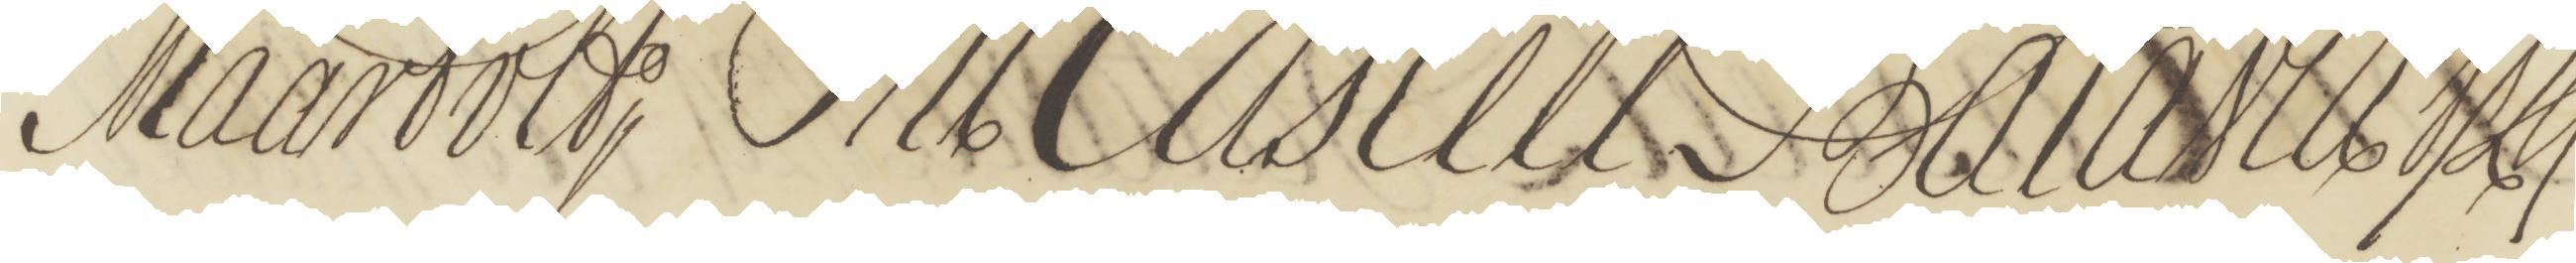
Maart vlt„o In 't Casteel Batavia 1724
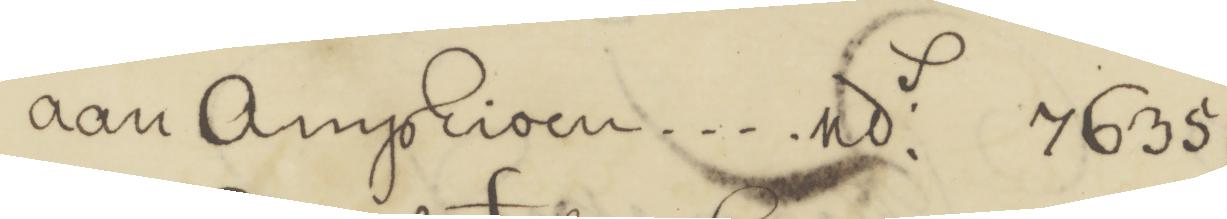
aan Amphioen- - - - rd:s 7635
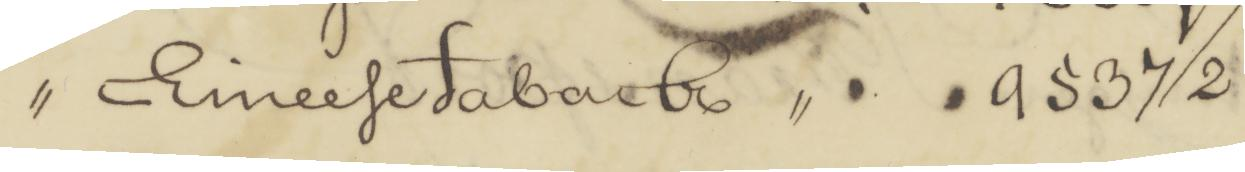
„ chineese taback „ 9537½
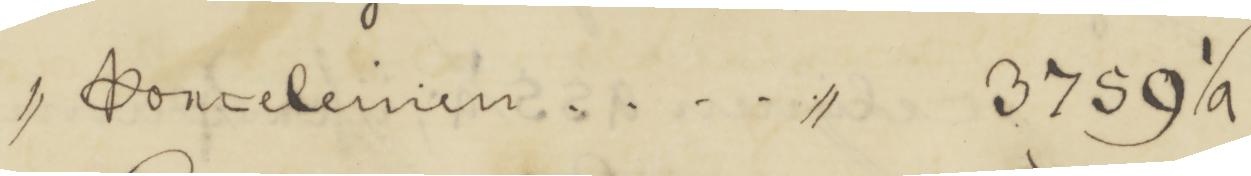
„ Porceleinen - - - - „ 3759¼
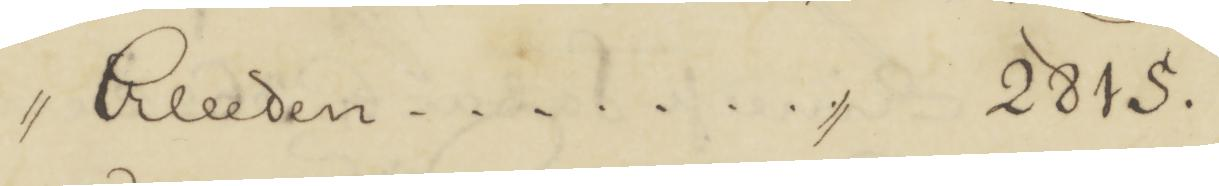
„ kleeden - - - - - - - „ 2815.
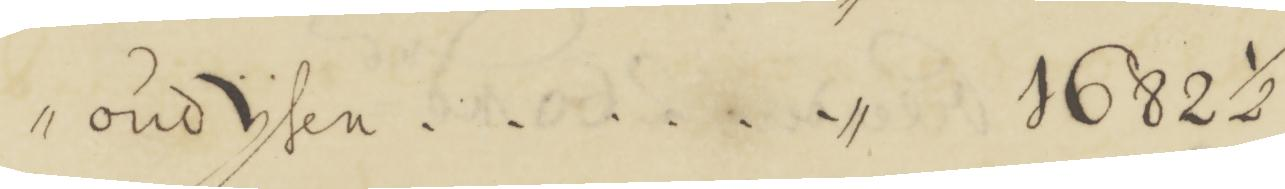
„ oud ijser - - - - - - „ 1682½
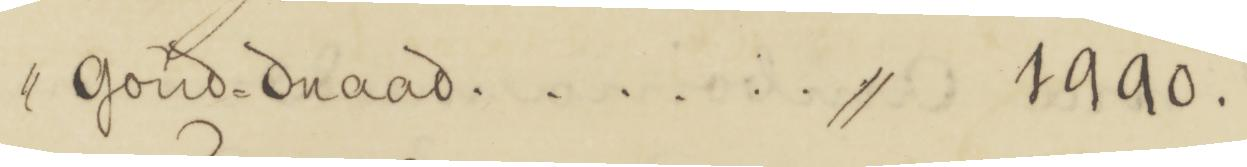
„ goud=draad - - - - - - „ 1990.
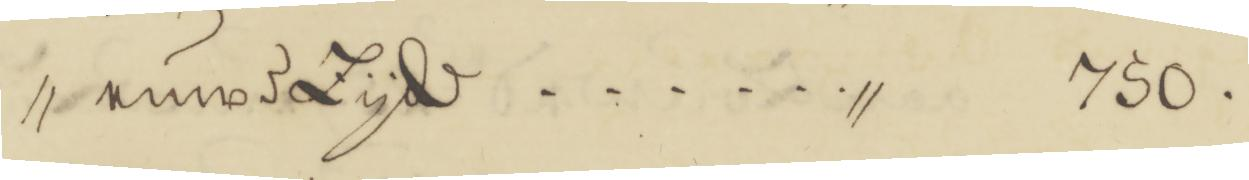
„ ruwe zijde - - - - - -„ 750.
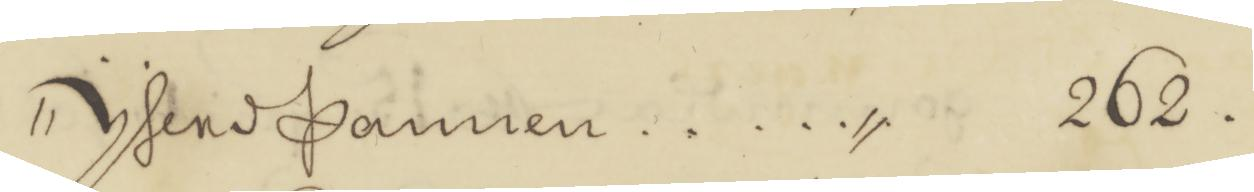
„ ijsere pannen - - - - - „ 262.
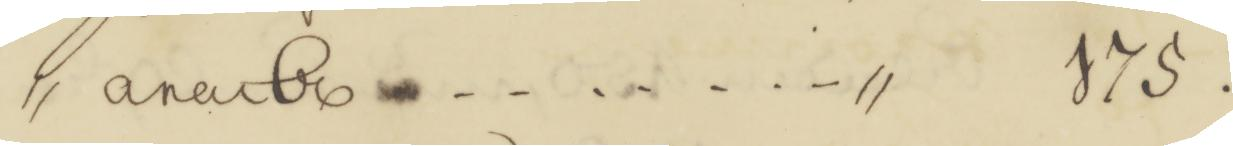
„ arack - - - - - - - „ 175.
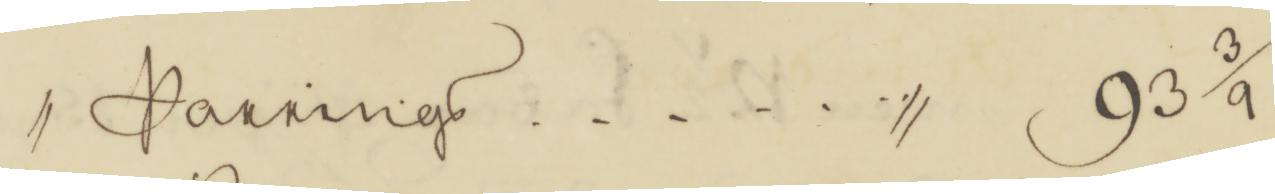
„ Parrings - - - - - - -„ 93 ¾
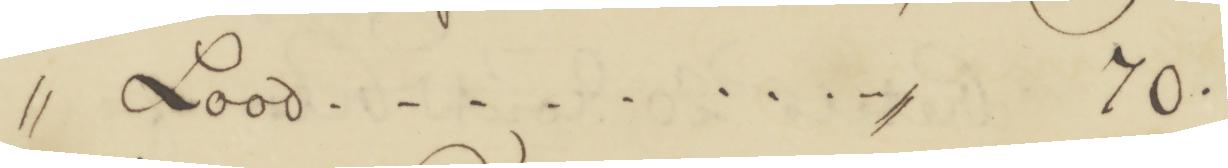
„ Lood - - - - - - - - - „ 70.
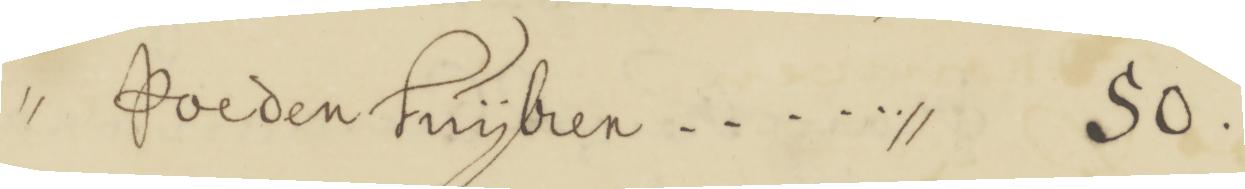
„ Poeder suijker - - - - - - „ 50.
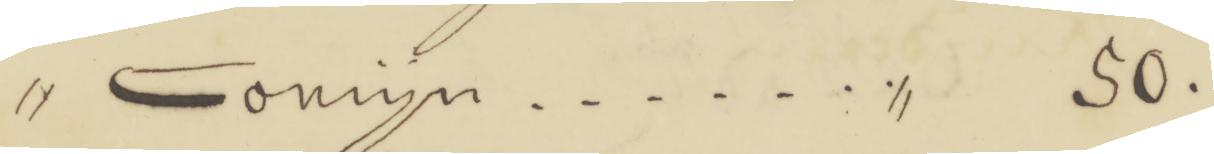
„ Comijn - - - - - - -„ 50.
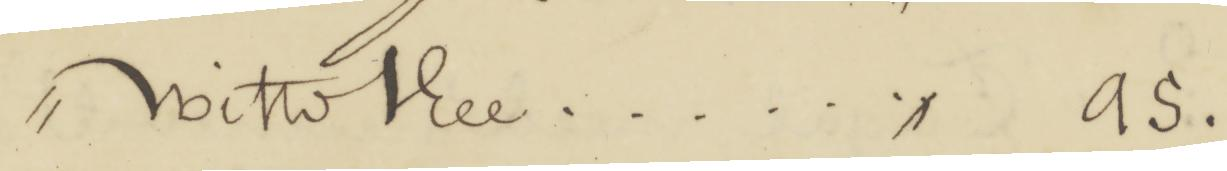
„ Witte thee - - - - - - „ 45.
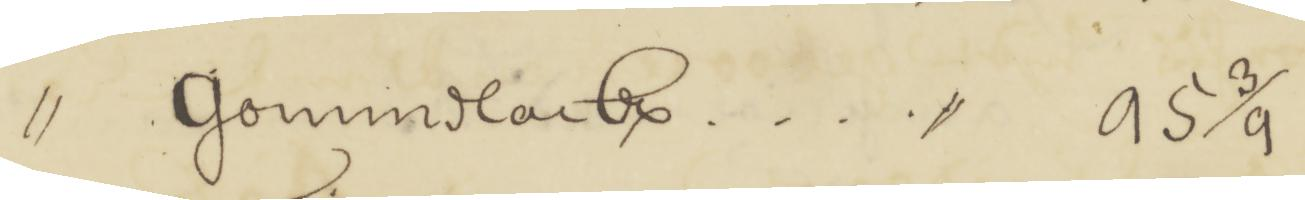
„ Gommelack - - - - „ 45 ¾
